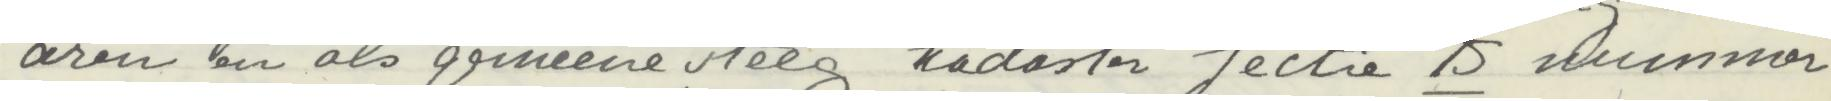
aren en als gemeene steeg kadaster sectie D nummer
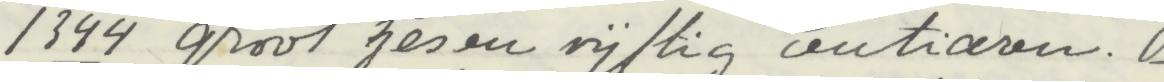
1344 groot zes en vijftig centiaren.
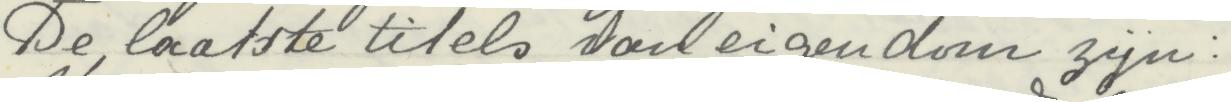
De laatste titels van eigendom zijn:
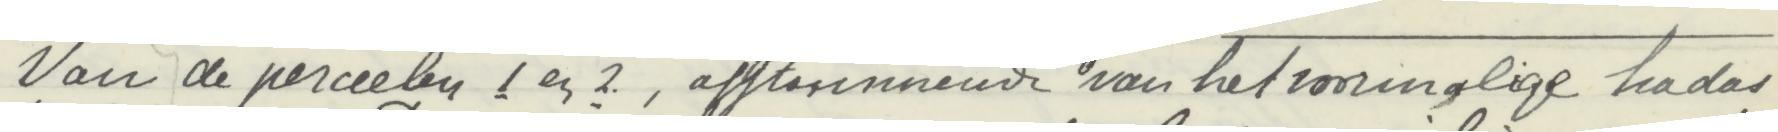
Van de perceelen 1 en 2., afstammende van het vooringlige kadas
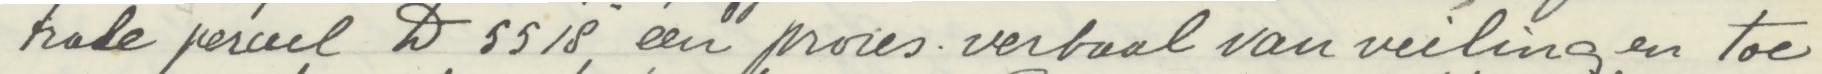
trale perceel D 5518, een proces verbaal van veiling en toe
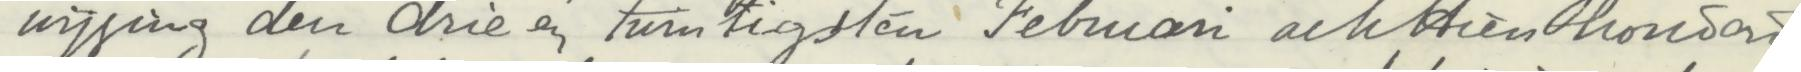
wijzing den drie en twintigsten Februari achttienhonderd
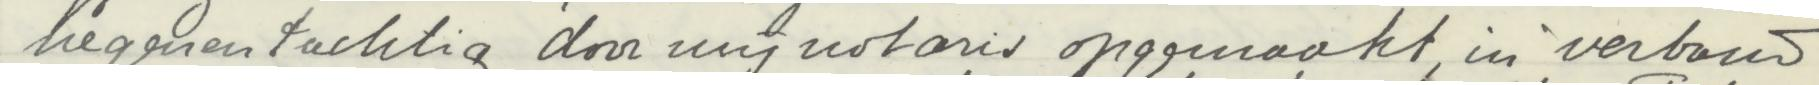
negen en tachtig door mij notaris opgemaakt in verband
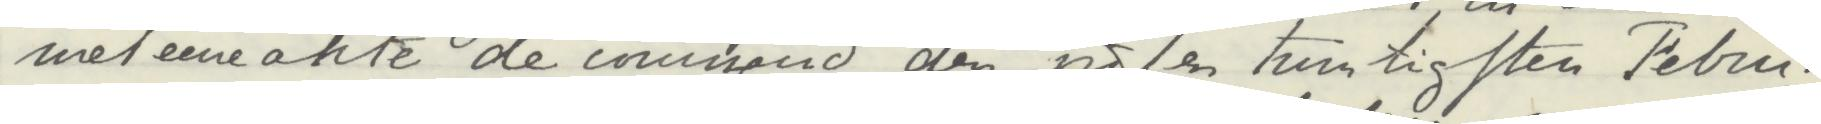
met eene akte de command den vijf en twintigsten Febru
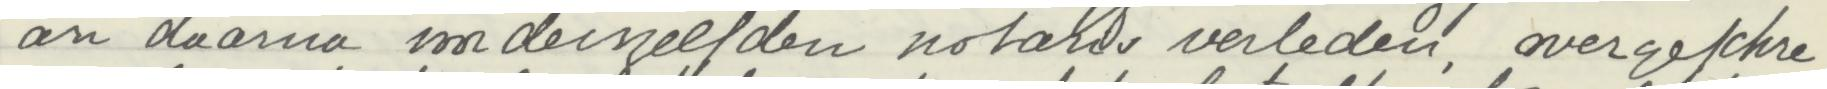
ari daana voor denzelfden notaris verleden, overgeschre
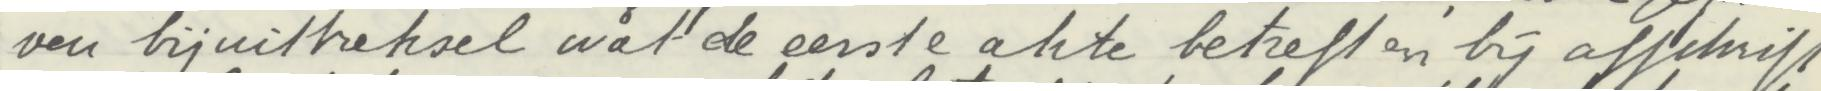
ven bij uittreksel wat de eerste akte betreft en bij afschrif
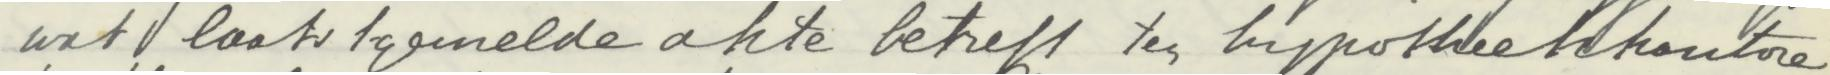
wat laatstgemelde akte betreft ten hypotheekkantore
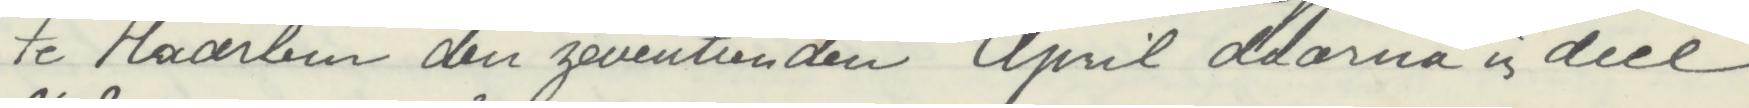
te Haarlem den zeventienden April daarna in deel
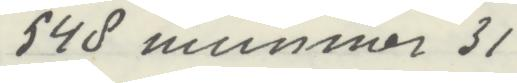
548 nummer 31
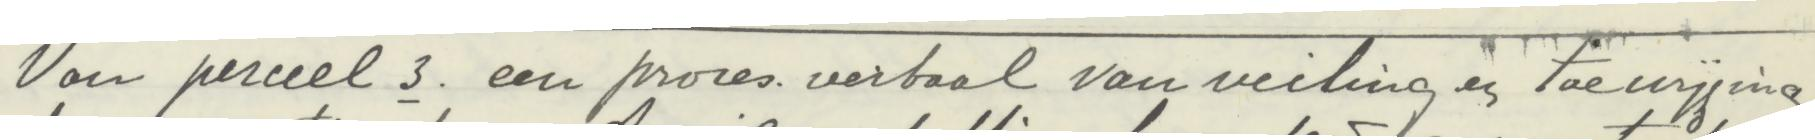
Van perceel 3. een proces-verbaal van veiling en toewijzing
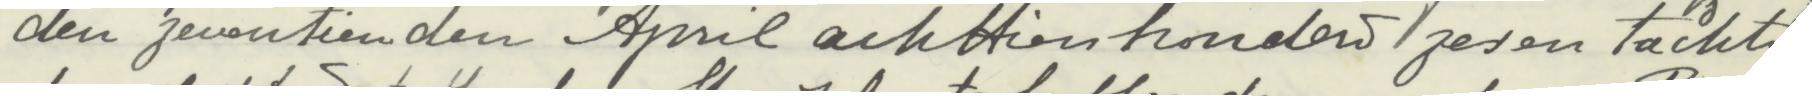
den zeventienden April achttienhonderd zes en tachtig
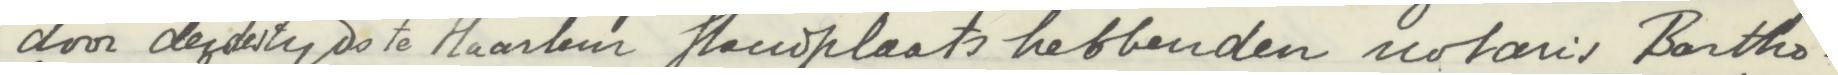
door den destyds te Haarlem standplaats hebbenden notaris Bartho
